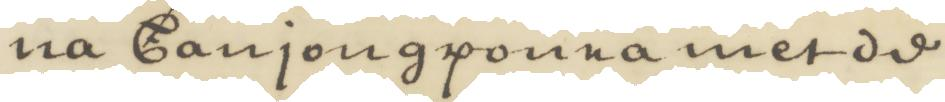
na Tanjongpoura met de
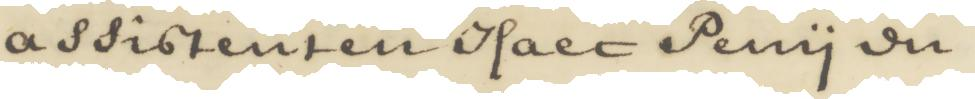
assistenten Isaec Penij en
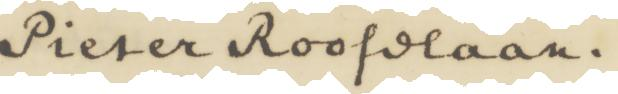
Pieter Rooselaan.
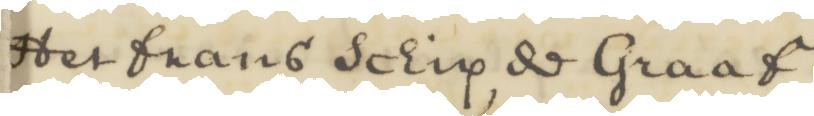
Het frans schip de Graaf
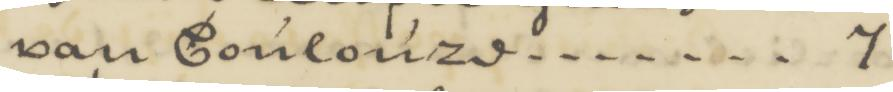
van Toulouze - - - - - - - 7
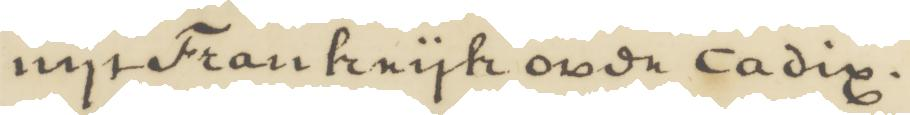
uijt Frankrijk over Cadix.
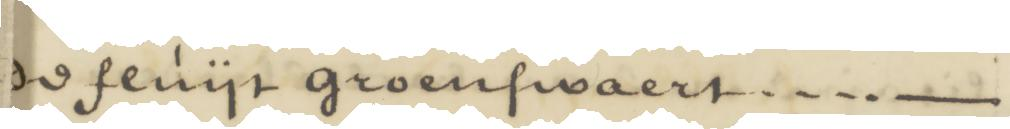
de fluijt groenswaert - - - - —
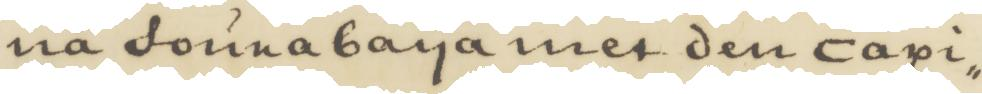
na Sounabaya met den capi„
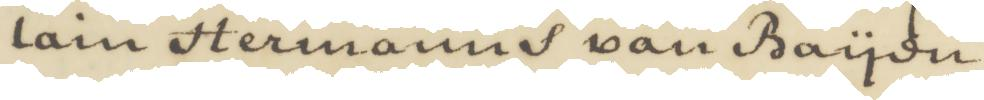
tain Hermanus van Baijen,
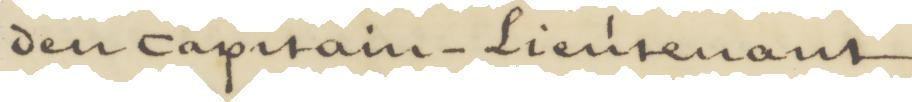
den capitain-Lieutenant
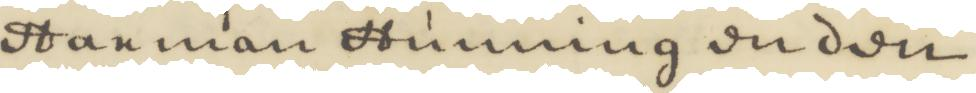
Harman Hunning en den
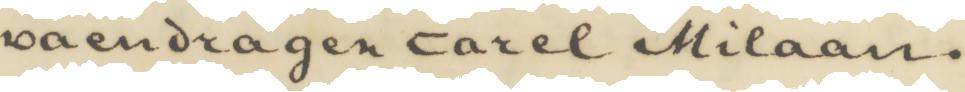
vaendrager Carel Milaan.
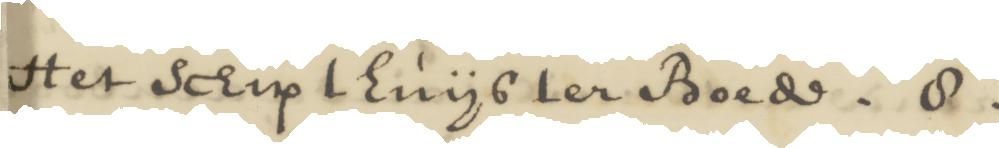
Het schip ’t huijs ter Boede - 8.
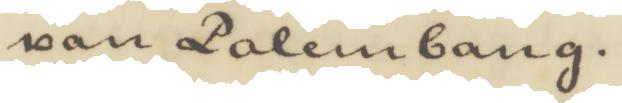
van Palembang.
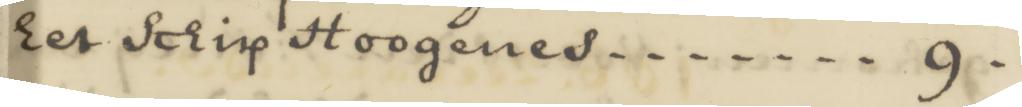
het schip Hoogenes - - - - - - - 9.
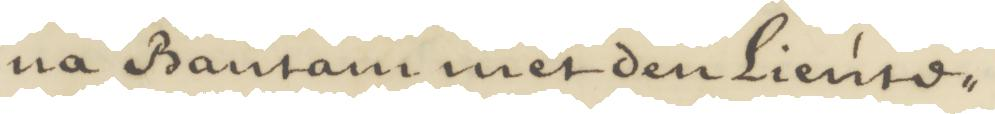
na Bantam met den Lieute„
